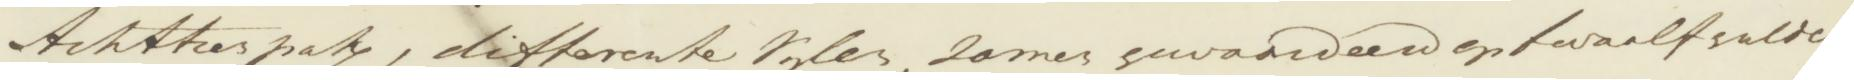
Achttien pak, differente Vijlen, zamen gewaardeerd op twaalf gulden
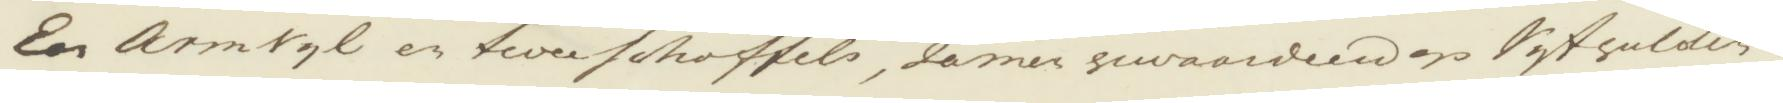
Een Armvyl en twee schoffels, zamen gewaardeerd op Vyf gulden.
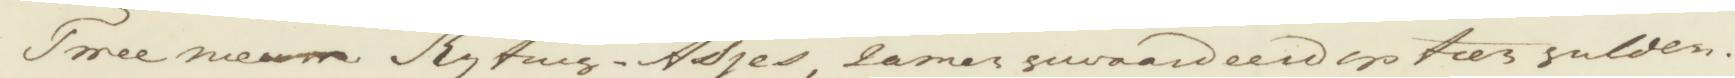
Twee nieuwe Rytuig-Asjes, zamen gewaardeerd op tien gulden.
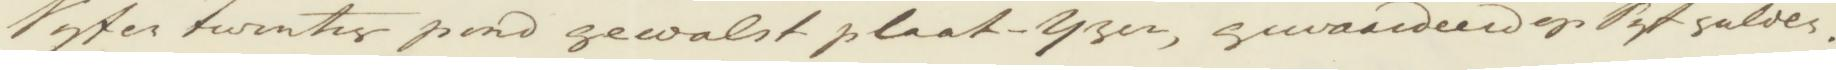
Vyf en twintig pond gewalst plaat-yzer, gewaardeerd op Vyf gulden.
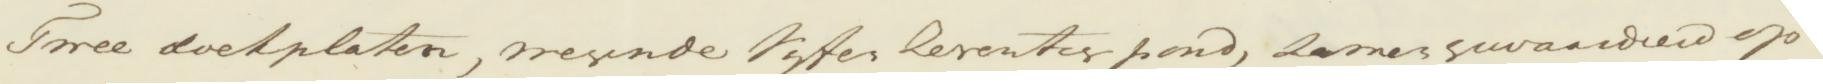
Twee doekplaten, wegende Vyfen Zeventig pond, zamen gewaardeerd op
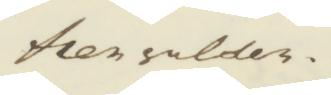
tien gulden.
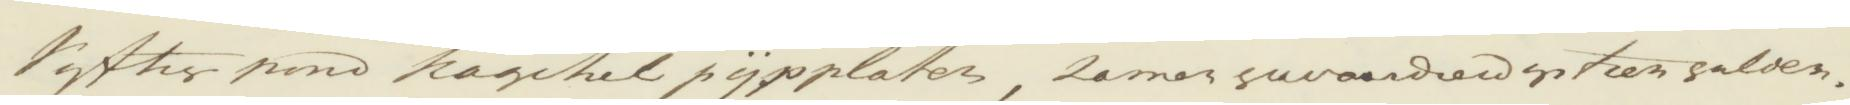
Vyftig pond kagchel pijpplaten zamen gewaardeerd op tien gulden.
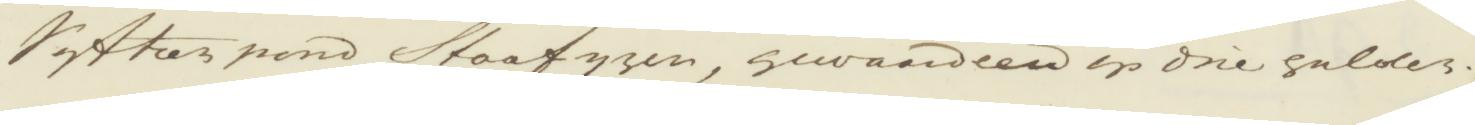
Vijftien pond Staafyzer, gewaardeerd op drie gulden.
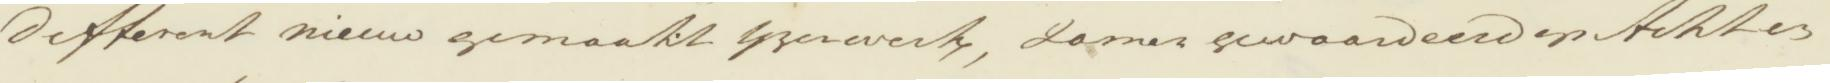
different nieuw gemaakt yzerwerk, zamen gewaardeerd op Achten
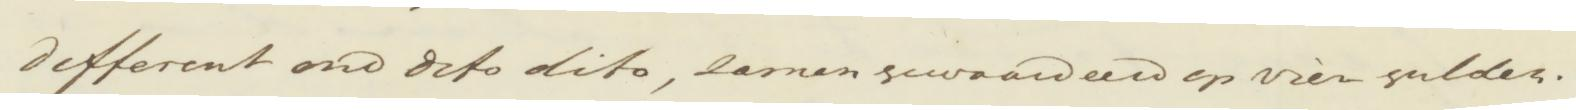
different ond dito dito, zamen gewaardeerd op vier gulden.
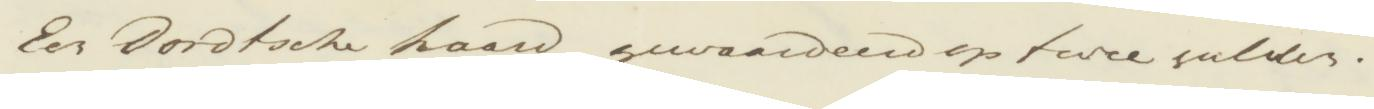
Een dordtsche haard, gewaardeerd op twee gulden.
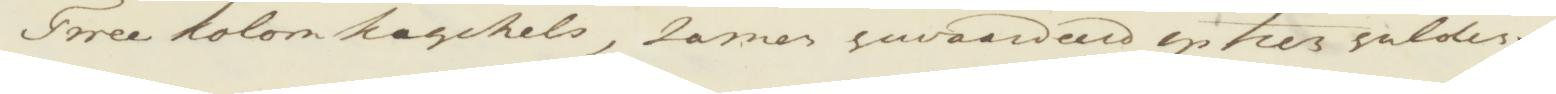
Twee kolomkagchels, zamen gewaardeerd op tien gulden.
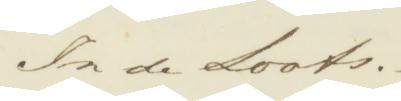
In de Loots.
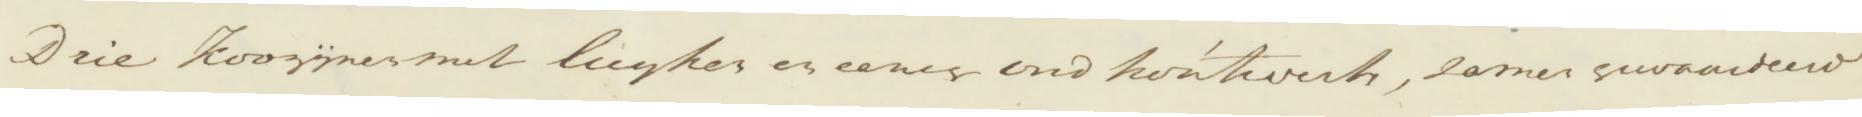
Drie koozijnen met luyken en eenig oud houtwerk, zamen gewaardeerd
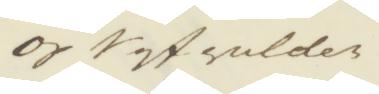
op Vyf gulden
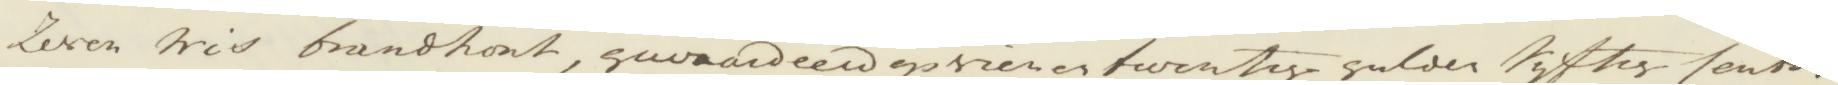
Zeven wis brandhout, gewaardeerd op vier en twintig gulden Vyftig Cents.
